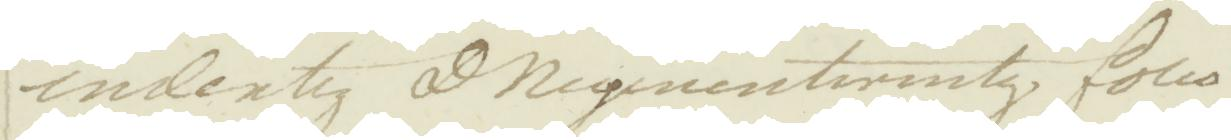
endertig D Negenentwintig folio
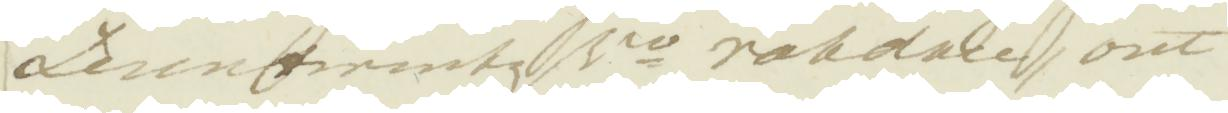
Zesentwintig V=o vak drie, ont
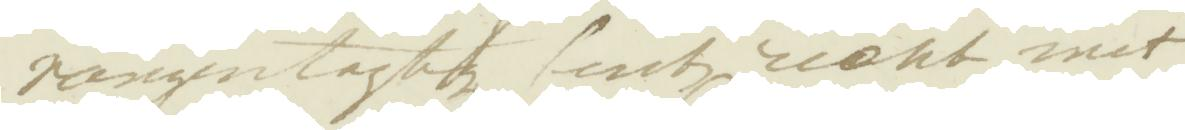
vangen tagtig Cents recht met
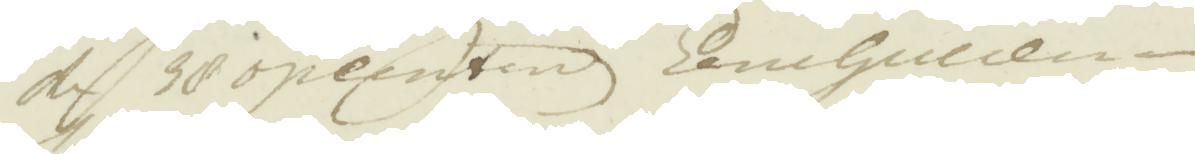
de 38 opcenten Eene Gulden —
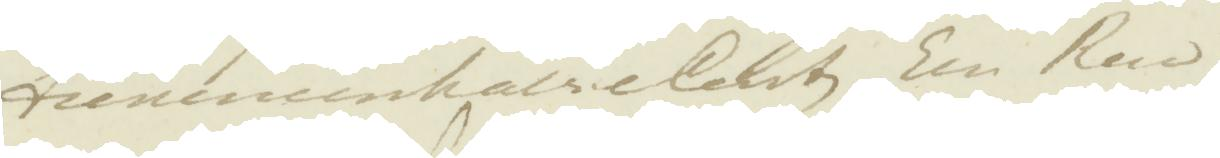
tieneneen halve Cents, Een Ren
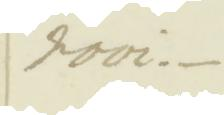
vooi.—
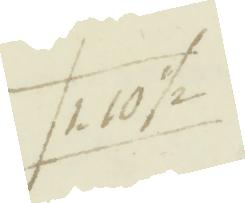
ƒ 1.10½:
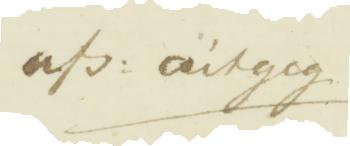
afs: uitgeg
